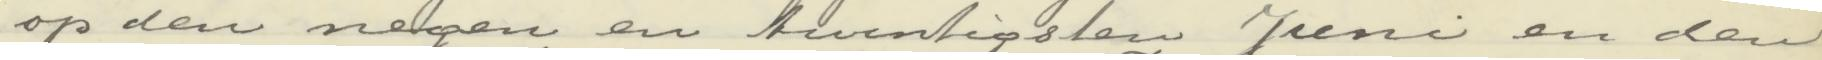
op den negen en twintigsten Juni en den
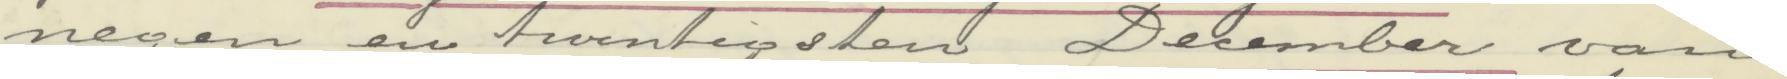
negen en twintigsten December van
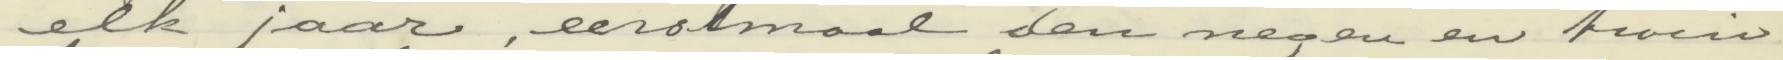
elk jaar, eerstmaal den negen en twin
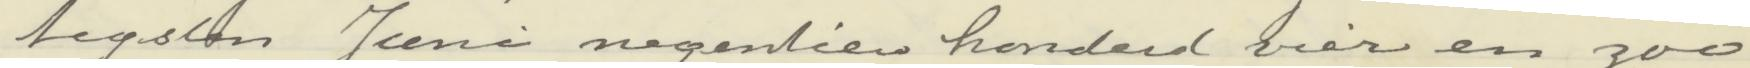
tigsten Juni negentien honderd vier en zoo
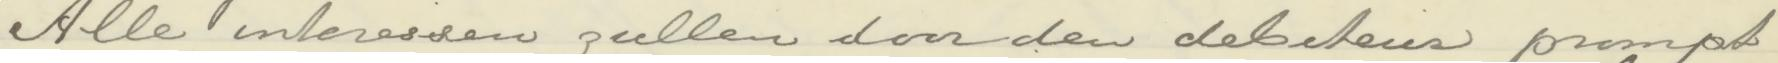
Alle interessen zullen door den debiteur prompt
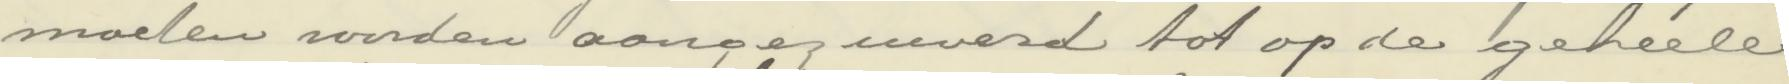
moeten worden aangezuiverd tot op de geheele
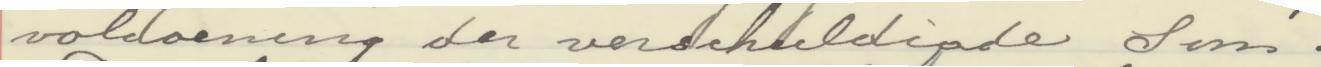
voldoening der verschuldigde som
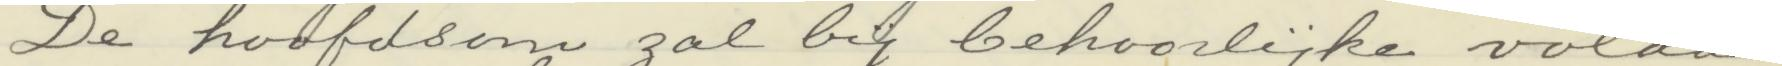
De hoofdsom zal bij behoorlijke voldoe
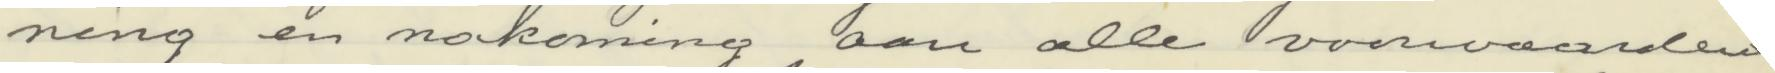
ning en nakoming aan alle voorwaarden
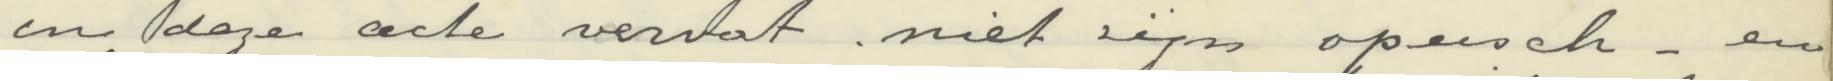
in deze acte vervat, niet zijn opeisch - en
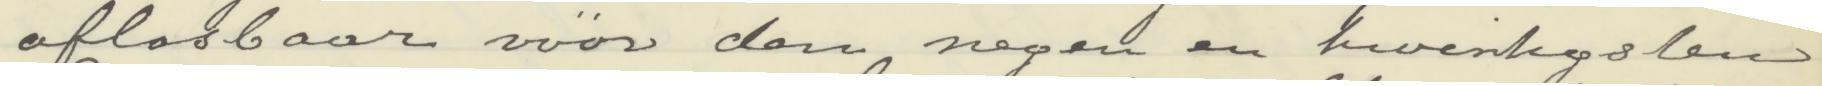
aflosbaar vóór den negen en twintigsten
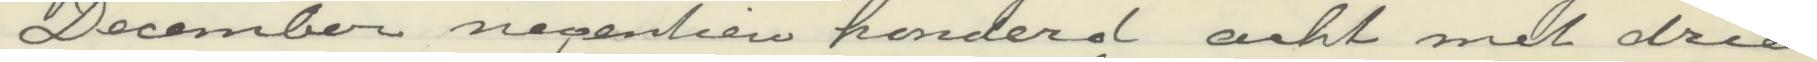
December negentien honderd acht met drie
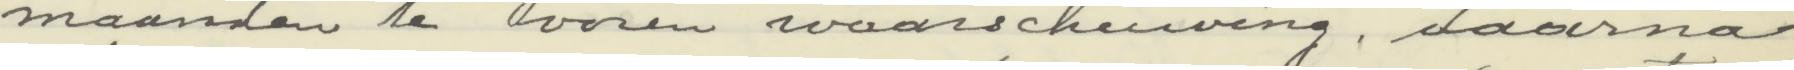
maanden te voren waarschuwing, daarna
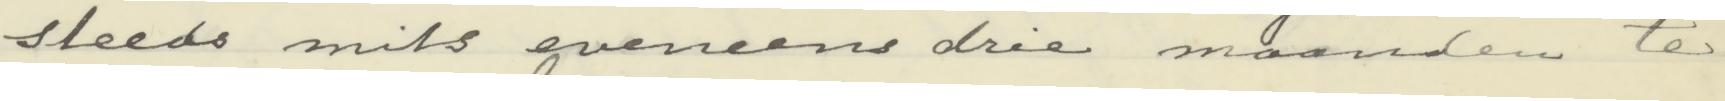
steeds mits eveneens drie maanden te
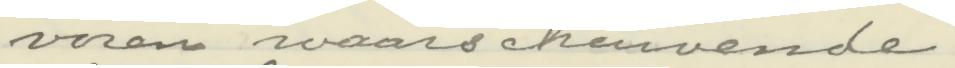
voren waarschuwende
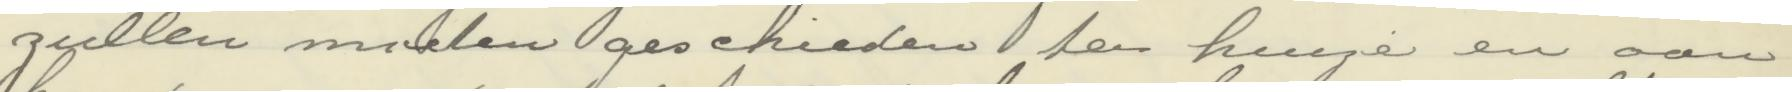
zullen moeten geschieden ten huize en aan
